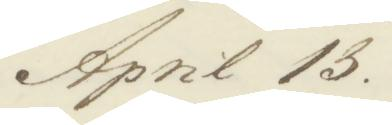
April 13.
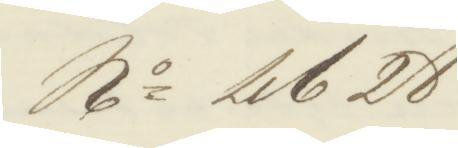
N=o 4628
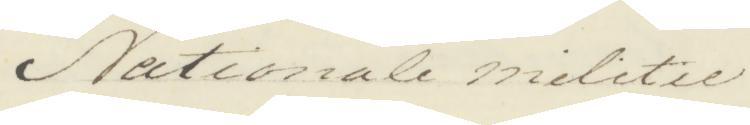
Nationale militie
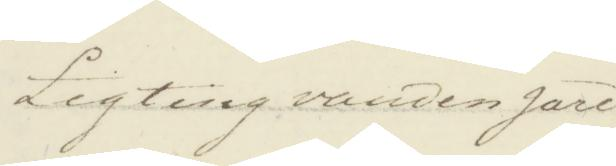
Ligting vanden Jare
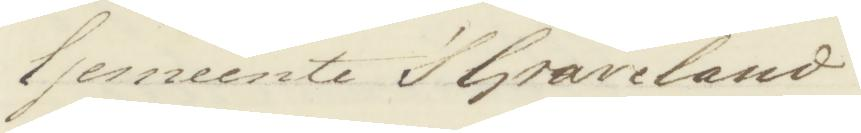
Gemeente 's Graveland
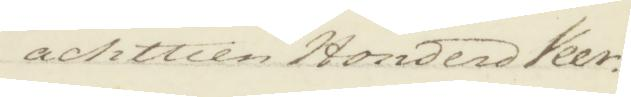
achttien Honderd Veer
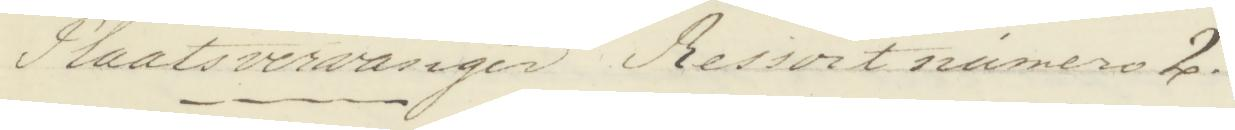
Plaatsvervanger Ressort numero 2.
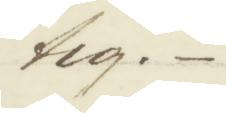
tig. —
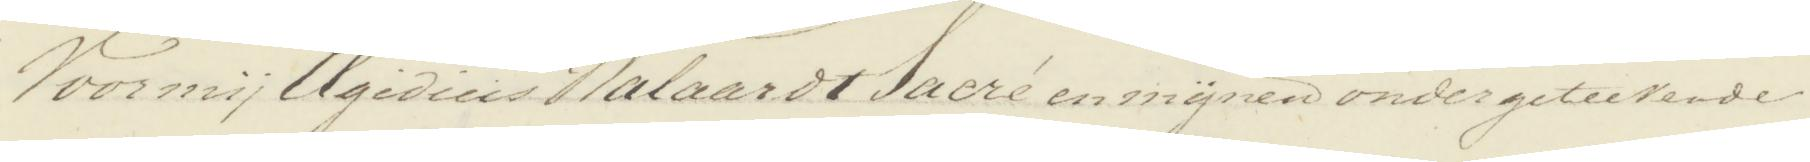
Voor mij AEgidius Walaardt Sacré en mijnen ondergeteekende
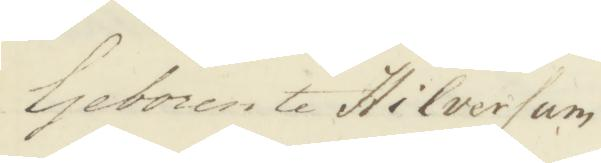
Geboren te Hilversum
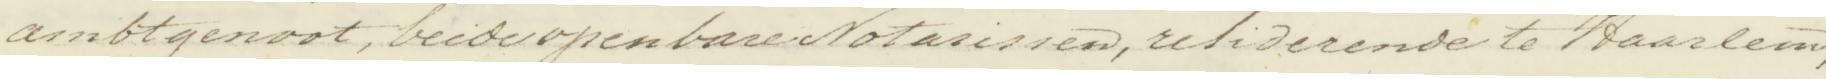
ambtgenoot, beide openbare Notarissen, residerende te Haarlem
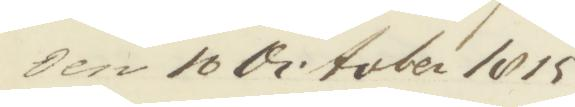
den 10 October 1815
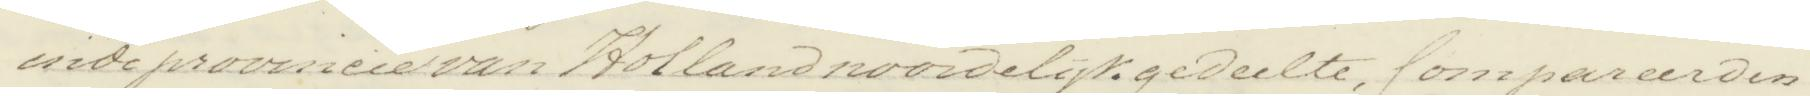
inde provincie van Holland noordelijk gedeelte, Compareerden
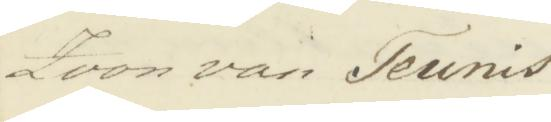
zoon van Teunis
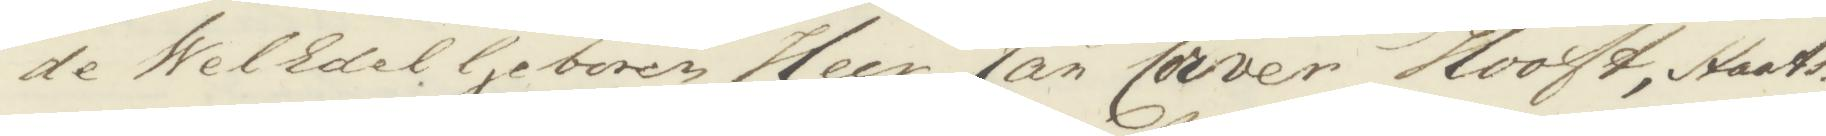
de Wel Edel Geboren Heer Jan Corver Hooft, staats
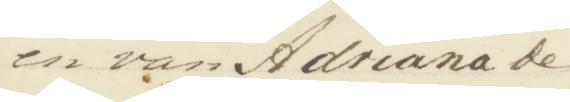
en van Adriana de
